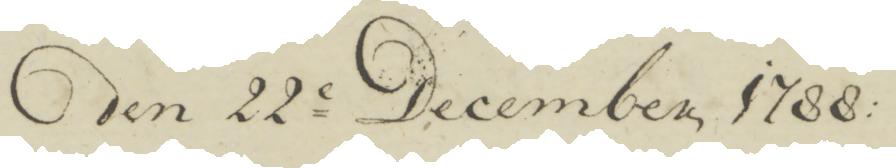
den 22=e December 1788:
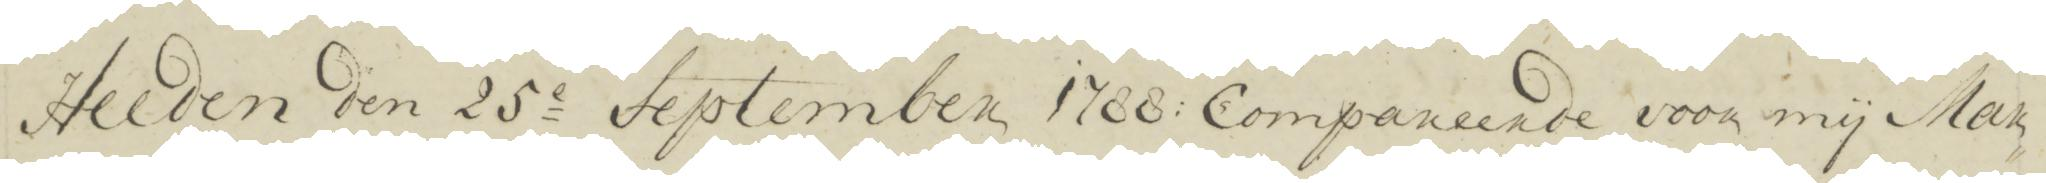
Heeden den 25=e September 1788: Compareerde voor mij Mar„
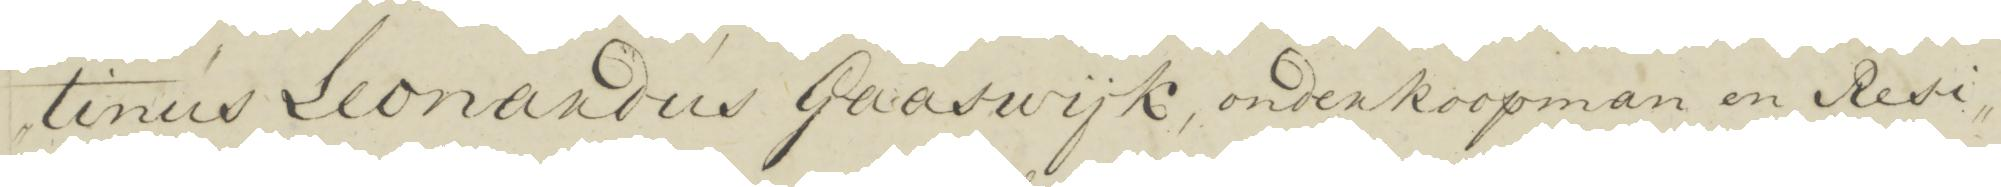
„tinus Leonardus Gaaswijk, onderkoopman en Resi„
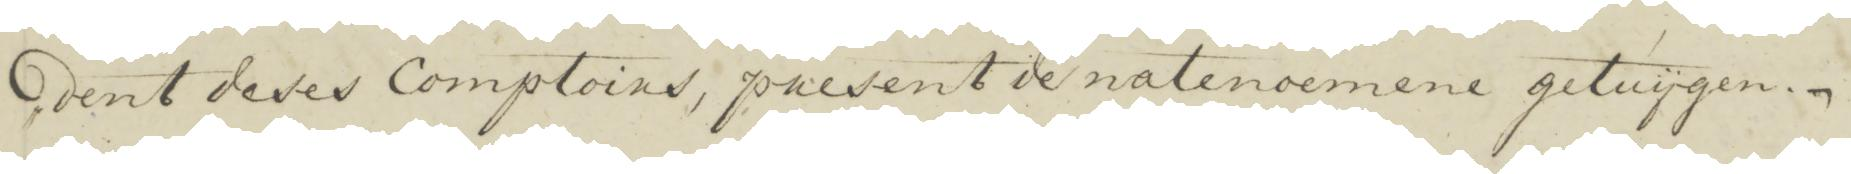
„dent deses Comptoirs, present de natenoemene getuijgen.-
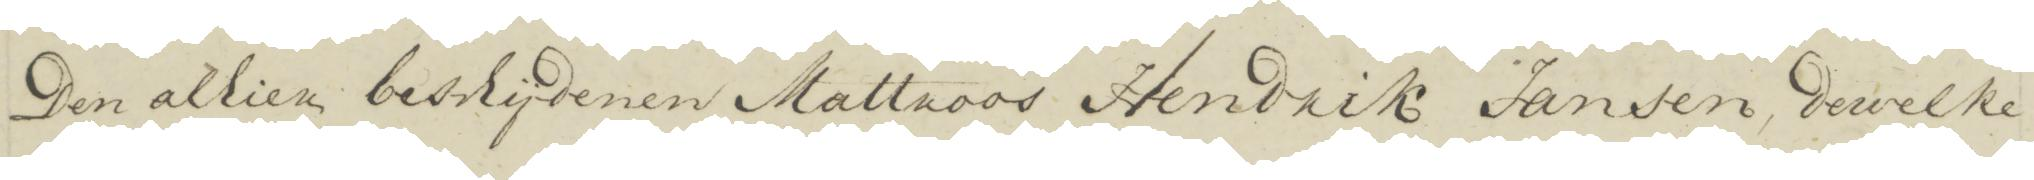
Den alhier beschijdenen Mattroos Hendrik Jansen, dewelke
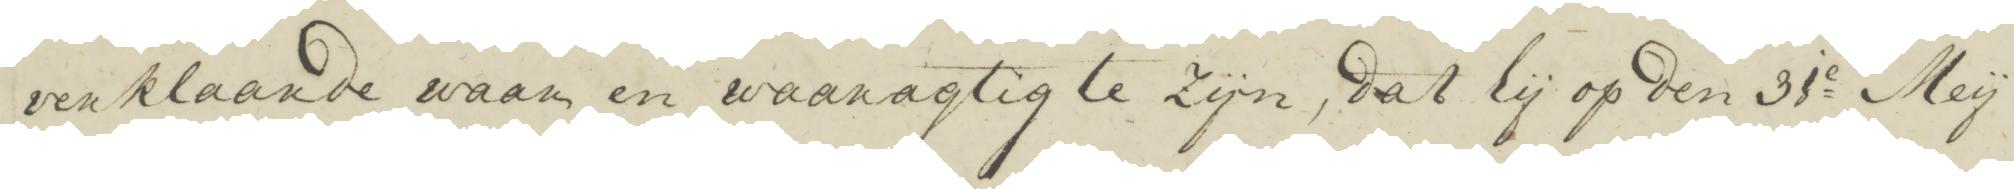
verklaarde waar en waaragtig te Zijn, dat hij op den 31=e Meij
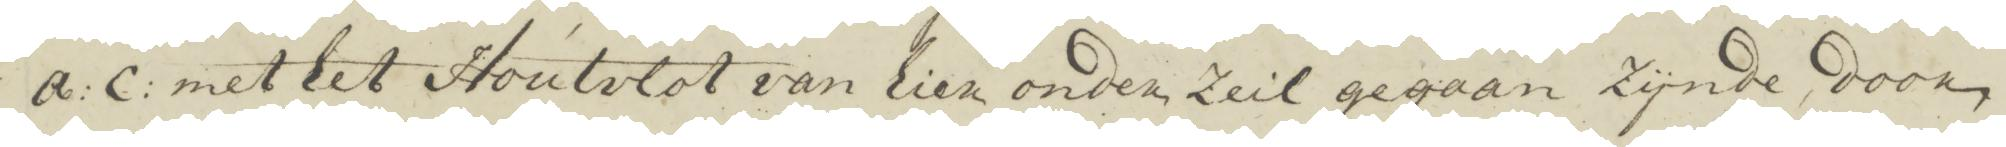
a: c: met het Houtvlot van hier onder zeil gegaan zijnde, door
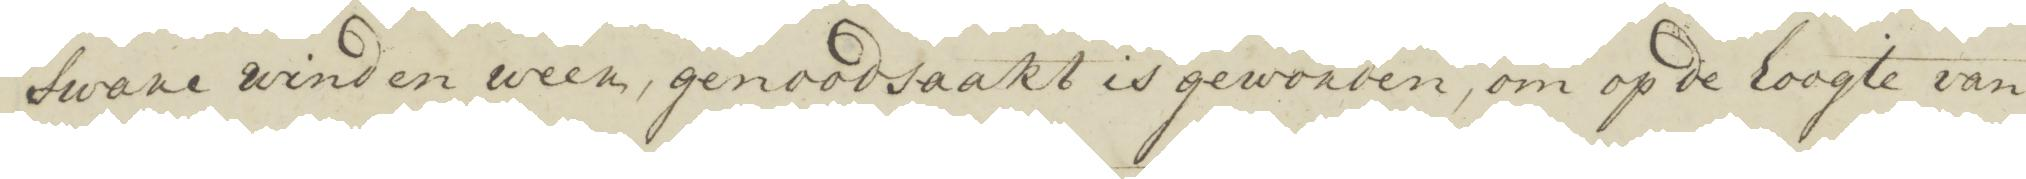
Sware wind en weer, genoodsaakt is geworden, om op de hoogte van
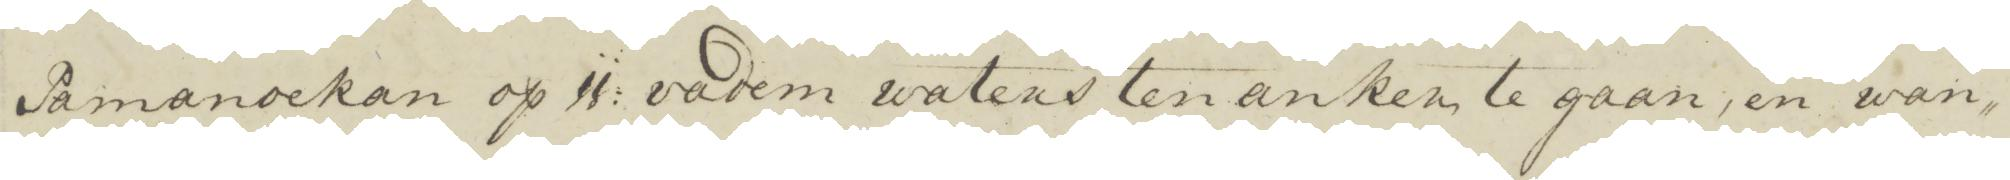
Pamanoekan op 11: vadem waters ten anker te gaan, en wan„
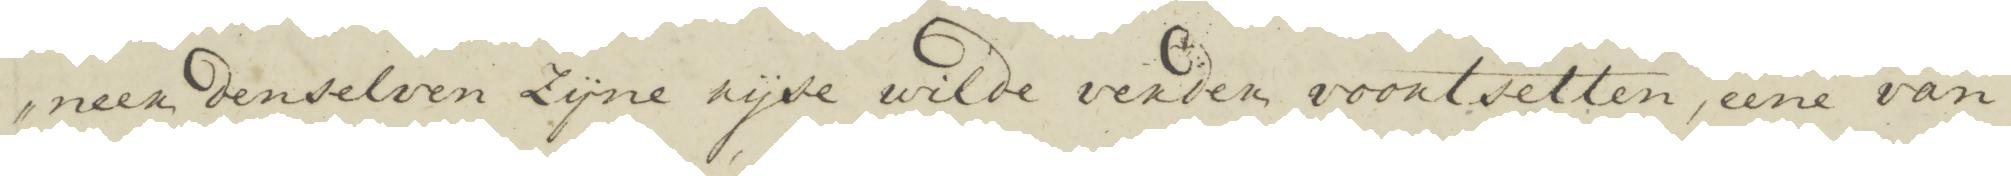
„neer denselven Zijne rijse wilde verder voortsetten, eene van
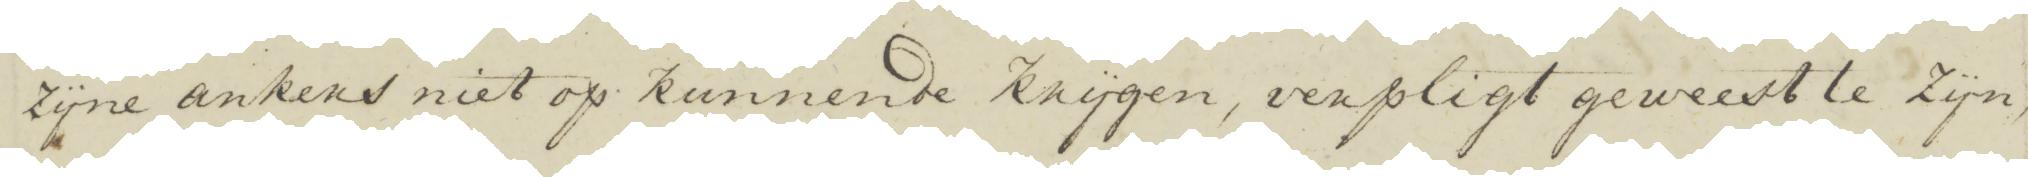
zijne ankers niet op Kunnende Krijgen, verpligt geweest te Zijn,
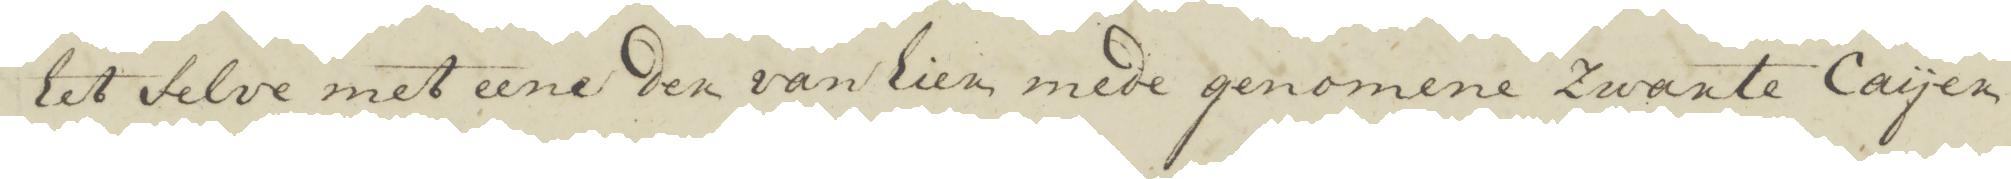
het selve met eene der van hier mede genomene zwarte Caijer
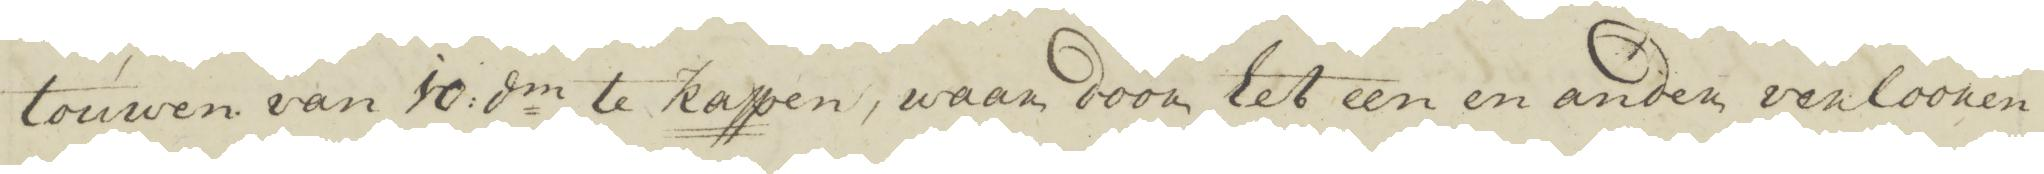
touwen van 10: d=m te kappen, waar door het een en ander verlooren
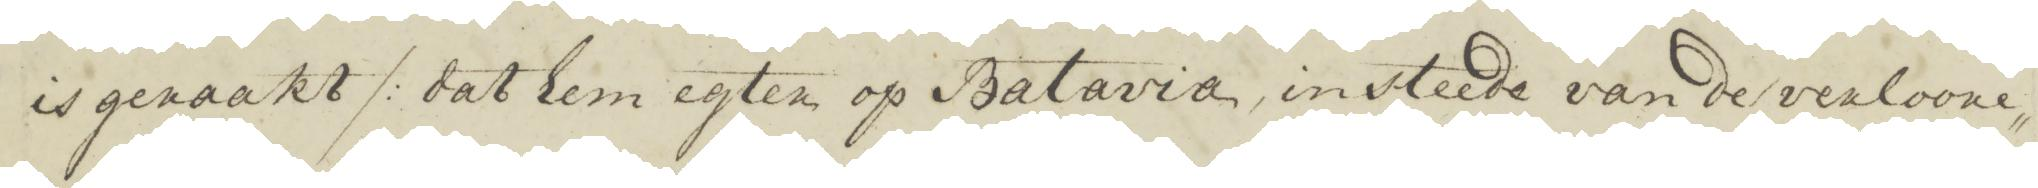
is geraakt /: dat hem egter op Batavia, in steede van de verloore„
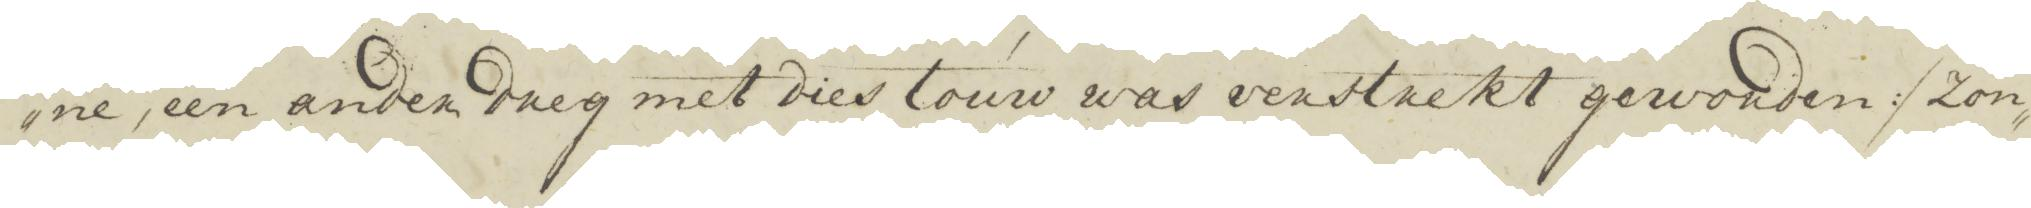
„ne, een ander dreg met dies touw was verstrekt geworden:/ Zon„
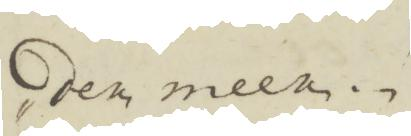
„der meer.-
